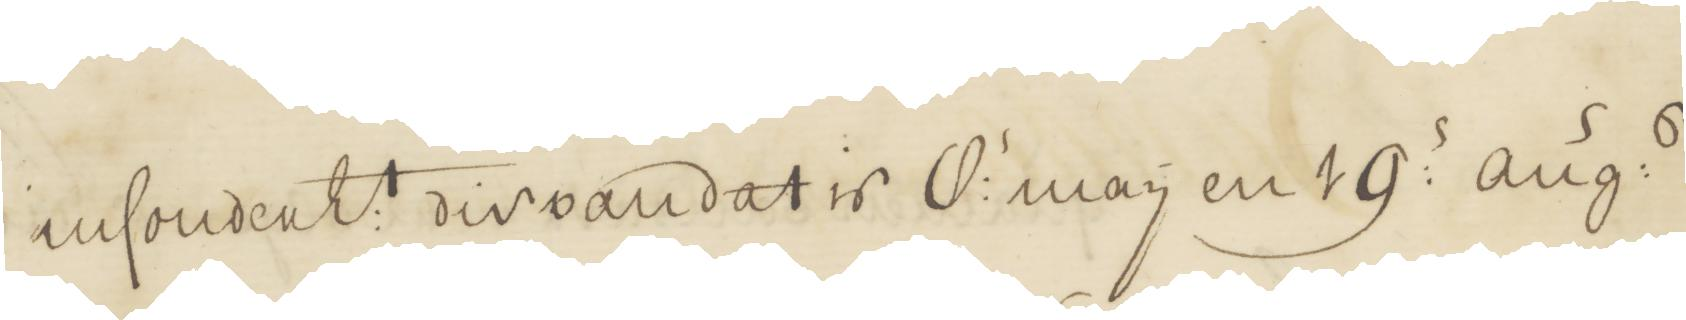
insonderh.t die van dat is 8:' maij en 19:' aug:s
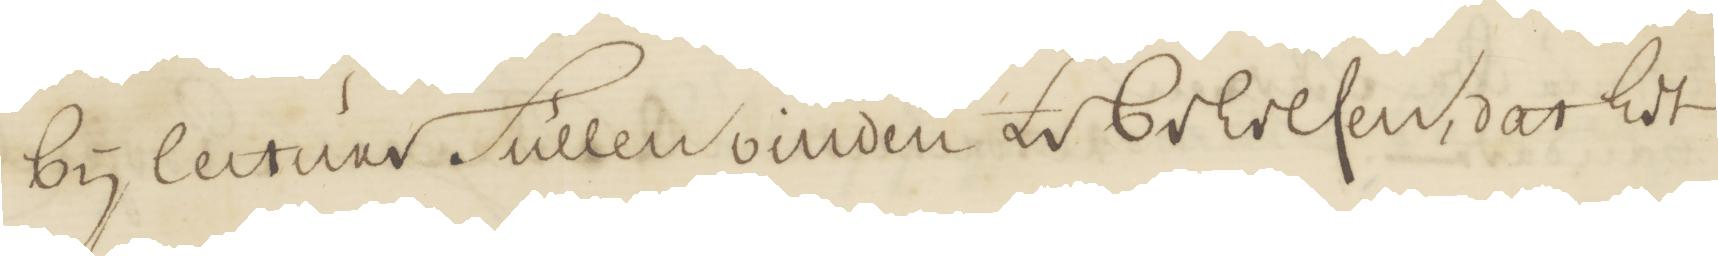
bij lecture sullen vinden te behelsen, dat het
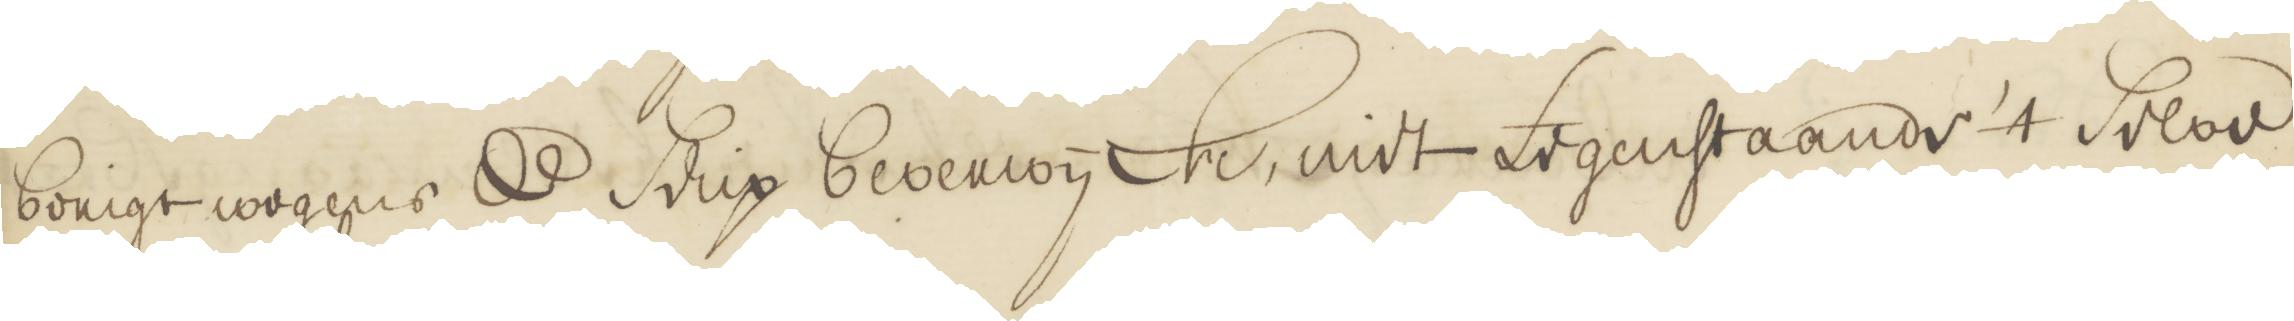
berigt wegens de schip beverwijck, niet tegenstaande ’t selve
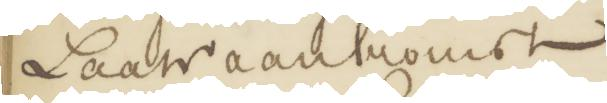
Laate aankomst
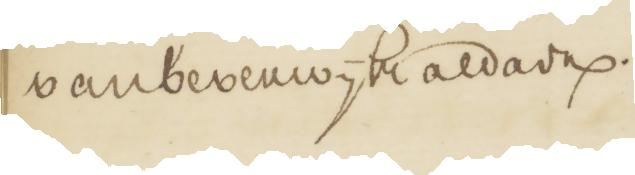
van beverwijk aldaer.
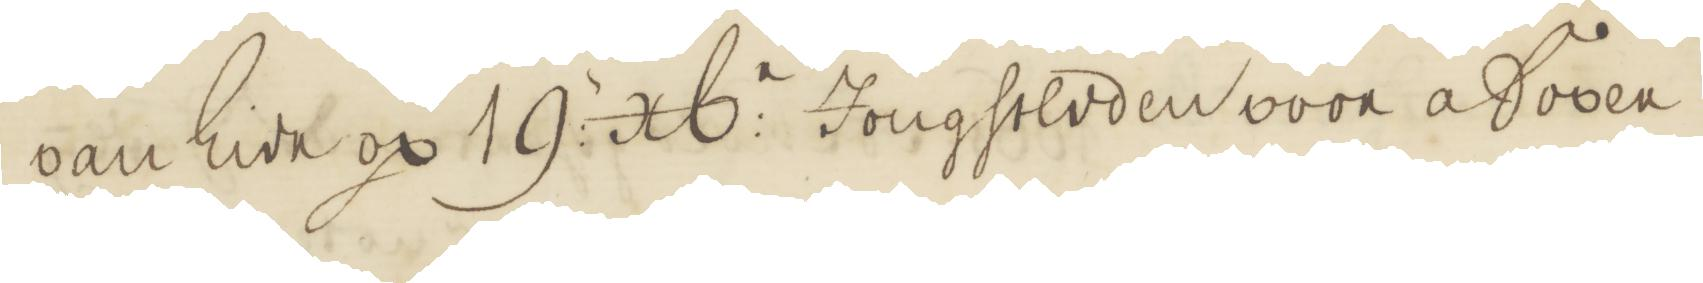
van hier op 19: xb:r Jongstleden voor af over
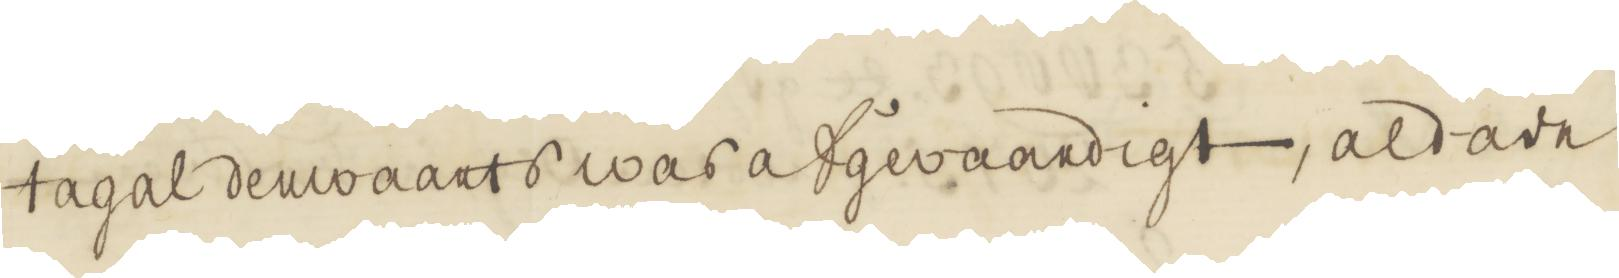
tagal derwaarts was afgevaardigt, aldaer
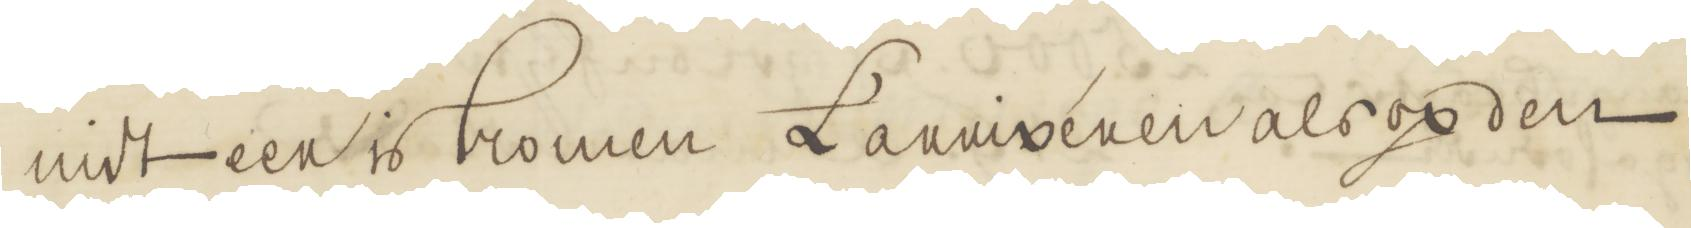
niet een is komen t'arrivéren als op den
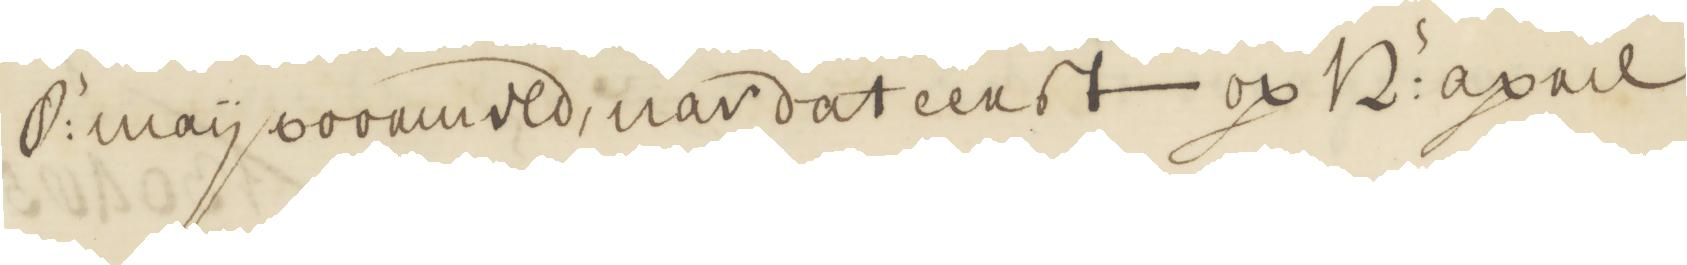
8:' maij voormeld, nae dat eerst op 12:' april
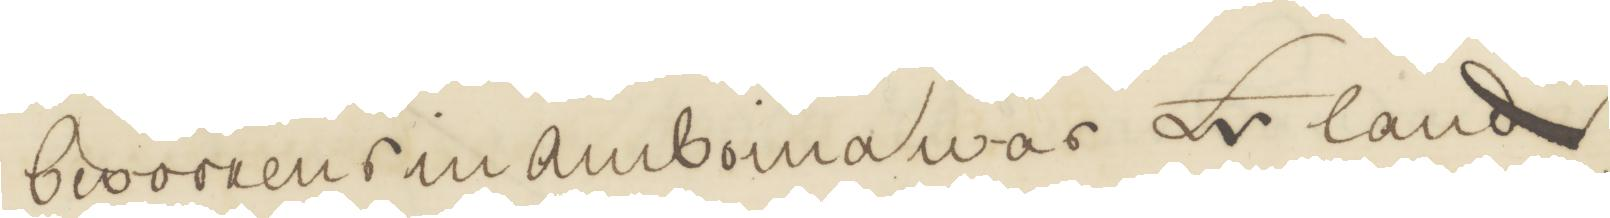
bevoorens in Amboina was te lande
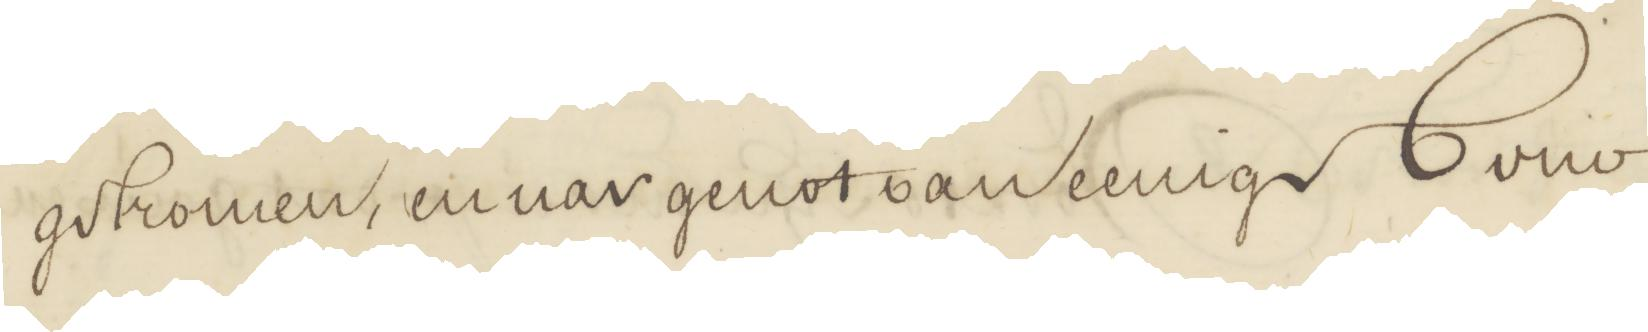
gekomen, en nae genot van eenige beno
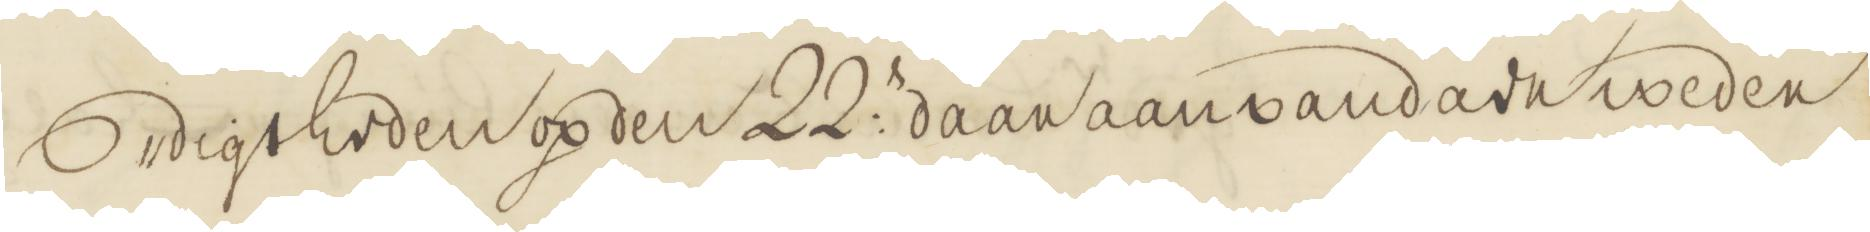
digtheden op den 22:e daar aan van daer weder
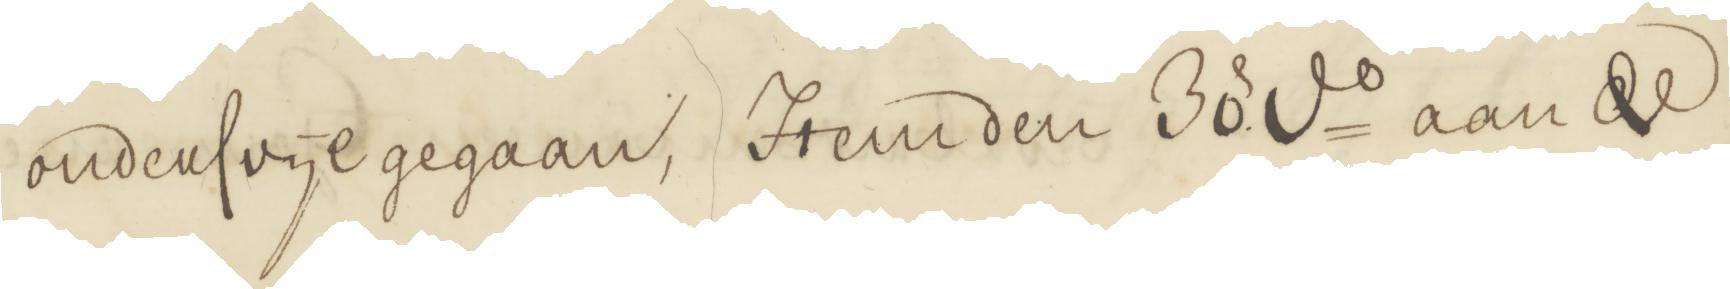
onderseijl gegaan, stemden 30.en d=o aan de
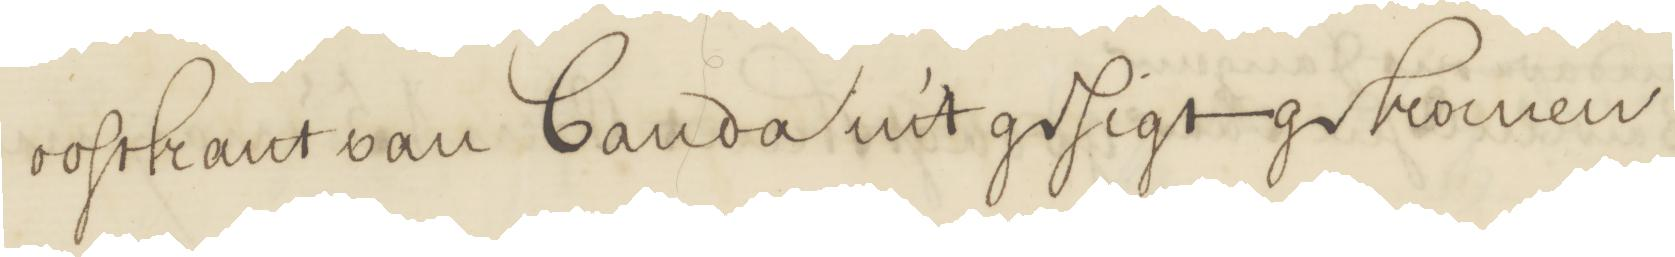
oostkant van banda in't gesigt gekomen
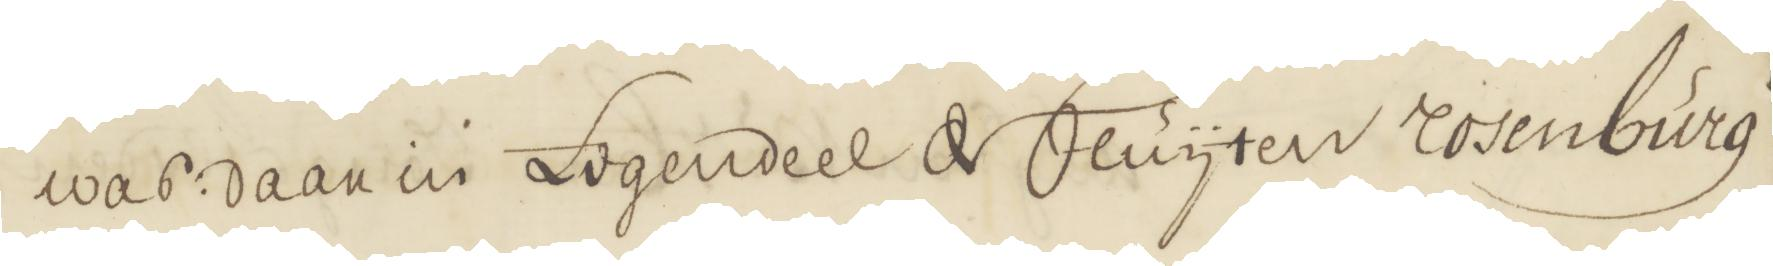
was: daar in tegendeel de fluijten rosenburg
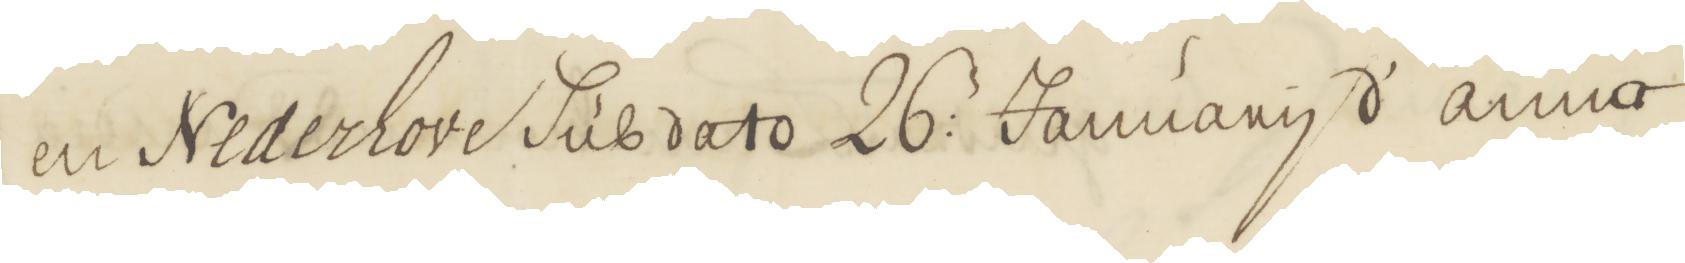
en Nederhove subdato 26:en Januarij d’ anna
